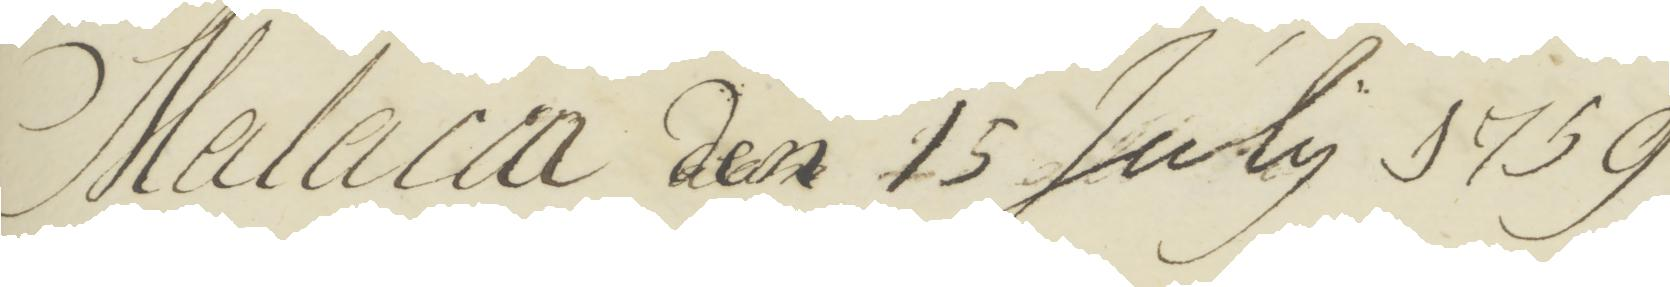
Malacca den 15 Junij 1759
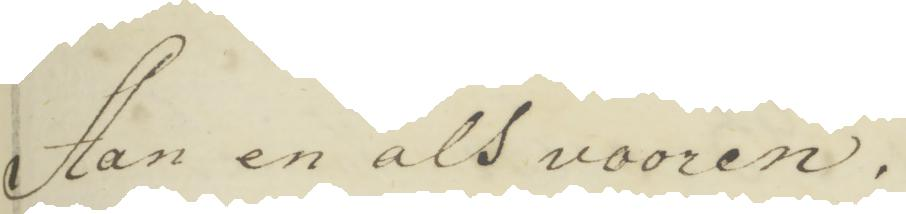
Aan en als vooren.
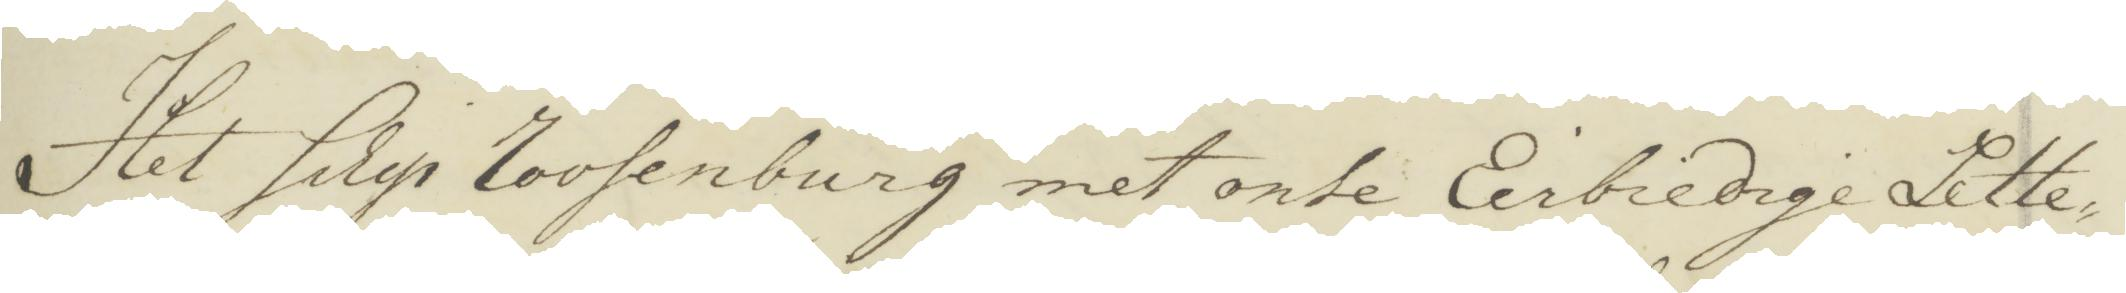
Het schip roosenburg met onse Eerbiedige Lette„
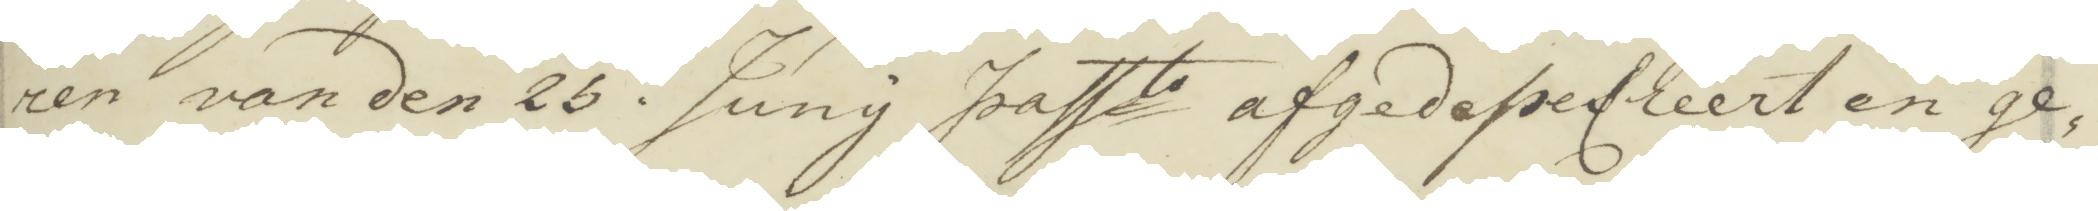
aen van den 25:' Junij pass=to afgedepecheert en ge„
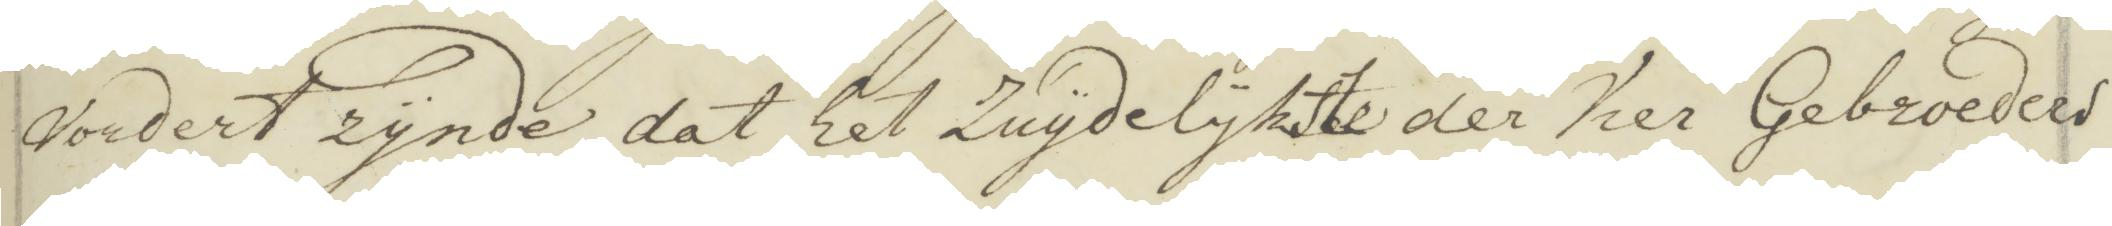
vordert zijnde dat het zuijdelijkste der vier Gebroeders
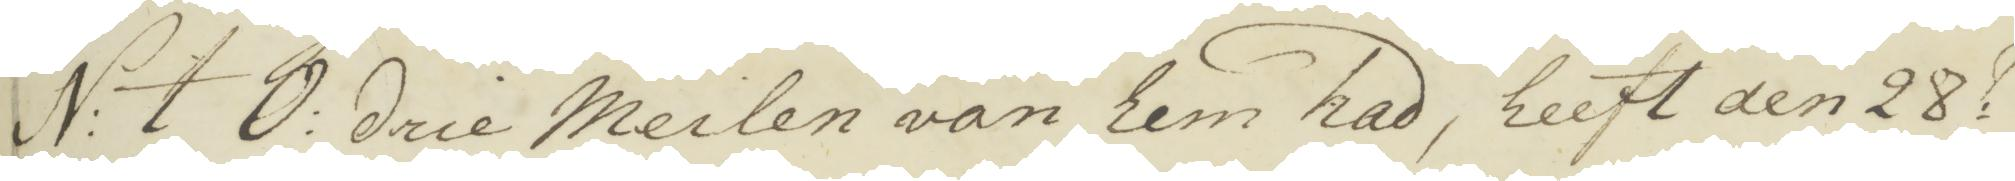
N: t O: drie meilen van hem had, heeft den 28:'
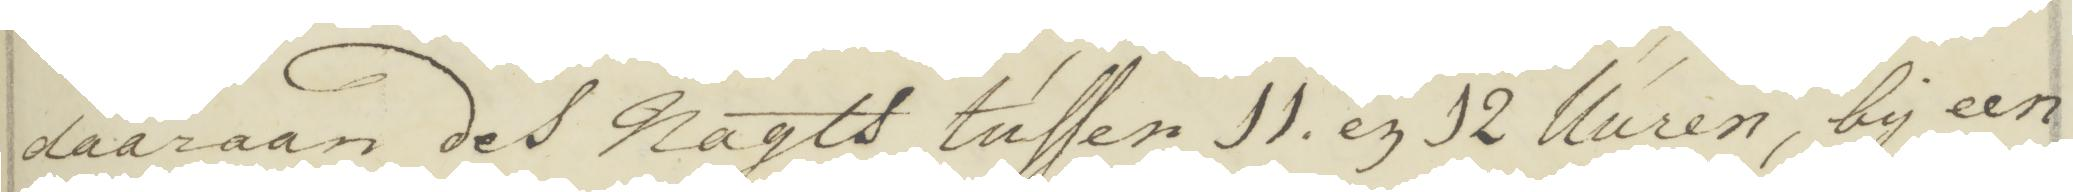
daar aan des nagts tussen 11. en 12 Uuren, bij een
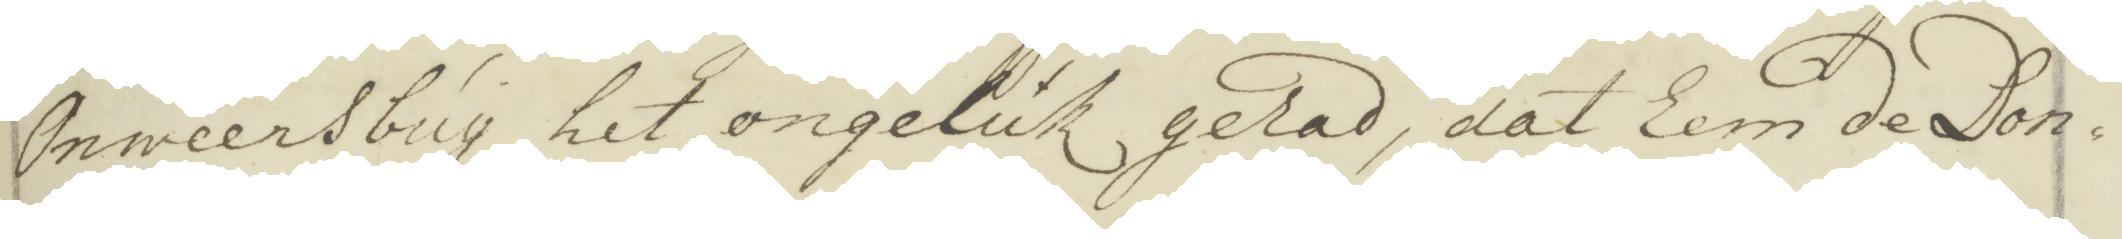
Onweersbuij het ongeluk gehad, dat hem de Don„
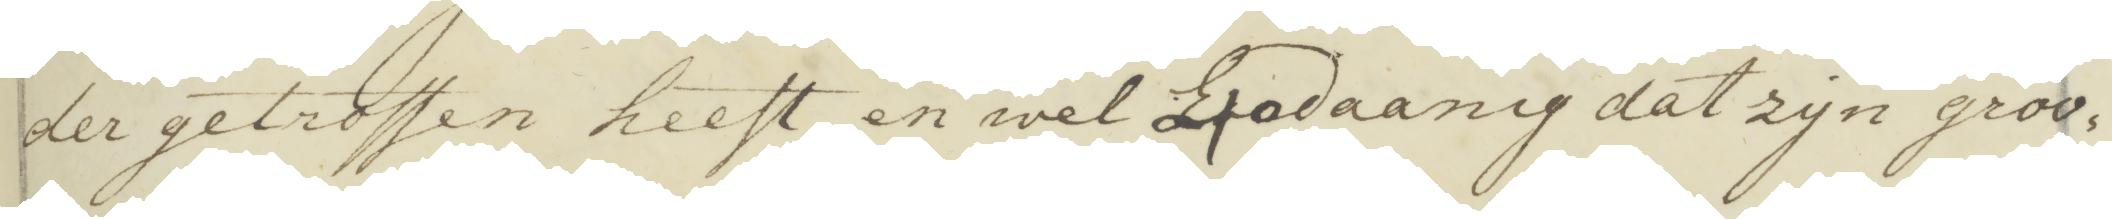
der getroffen heeft en wel zodaanig dat zijn groo„
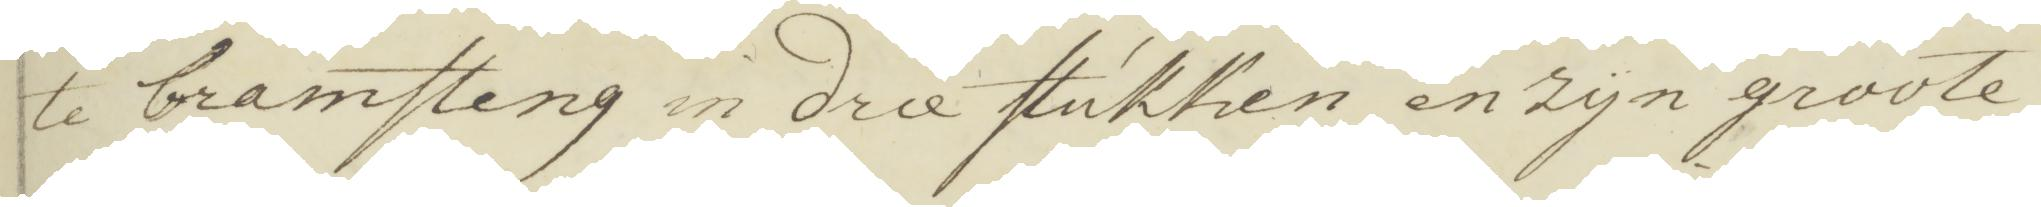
te bramsteng in drie stukken en zijn groote
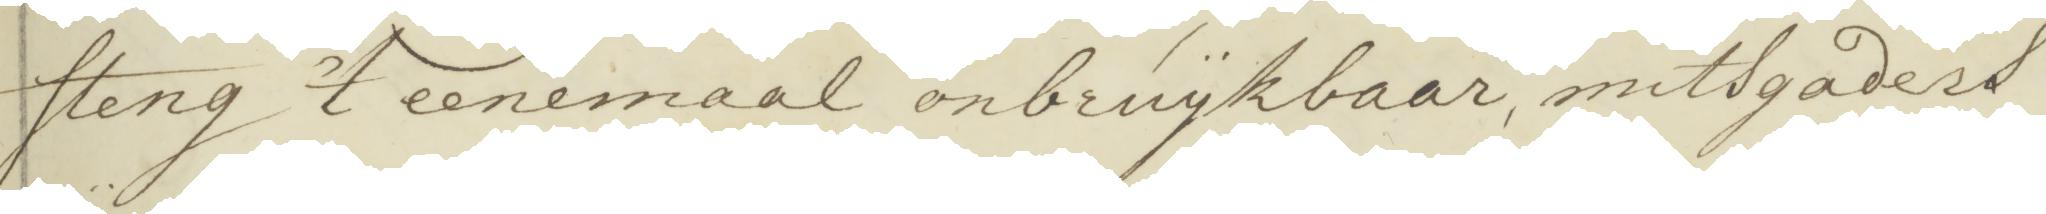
steng ’t eenemaal onbruijkbaar, mitsgaders
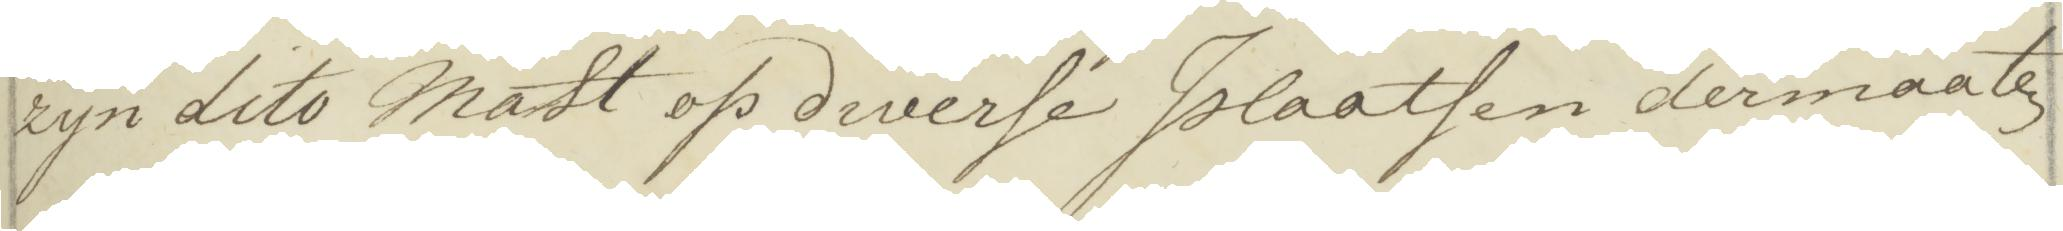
zijn dito mast op diverse plaatsen dermaaten
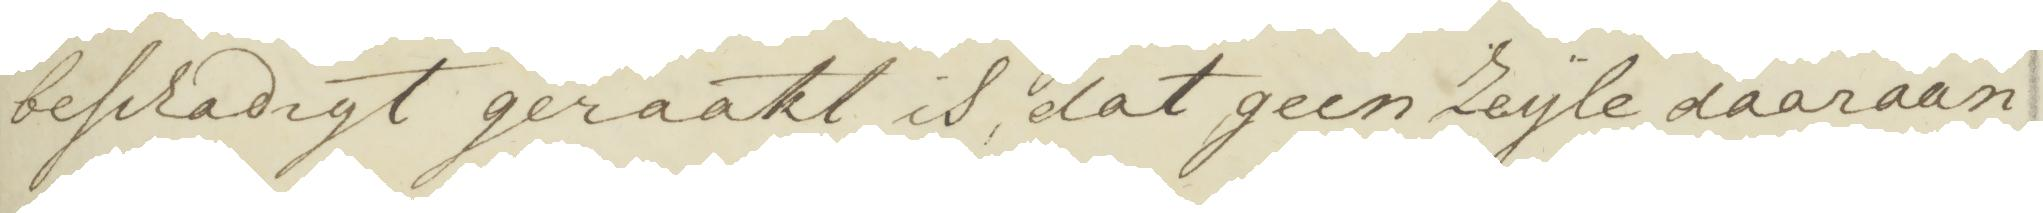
beschadigt geraakt is, dat geen zeijle daaraan
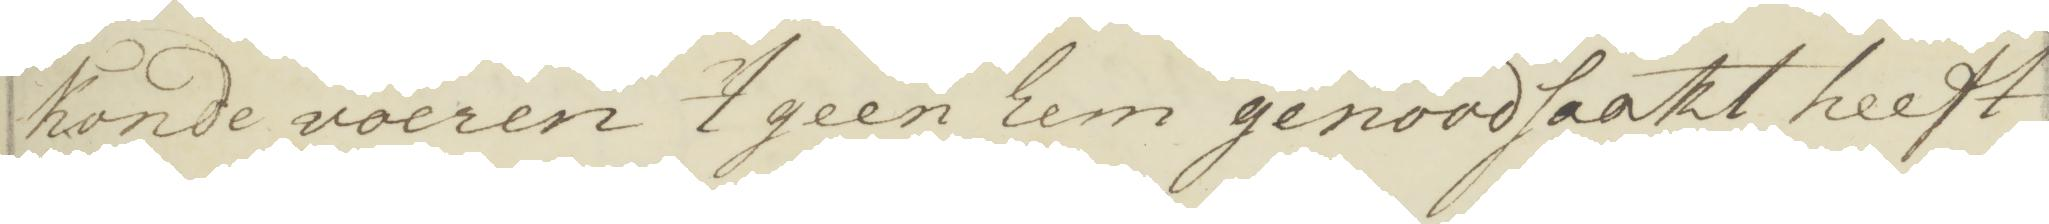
konde voeren ’t geen hem genoodsaakt heeft
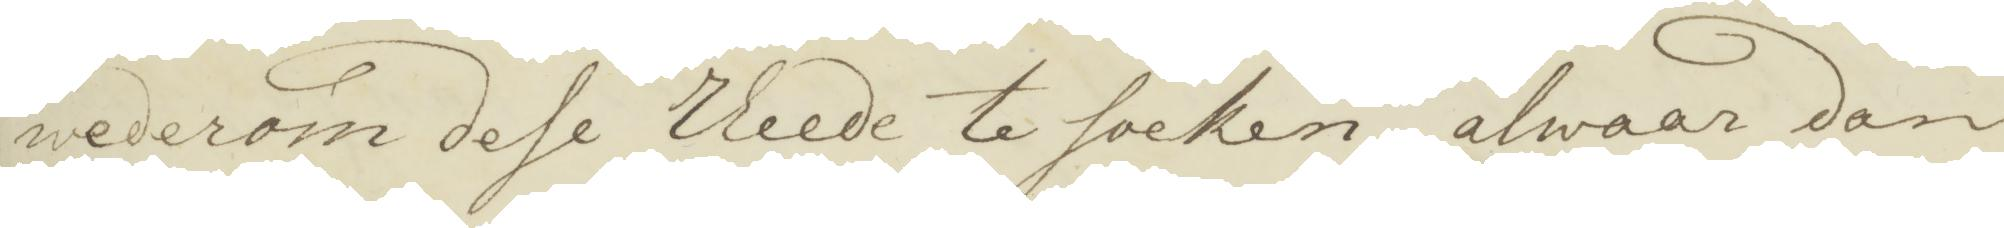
nederom dese rheede te soeken alwaar dan
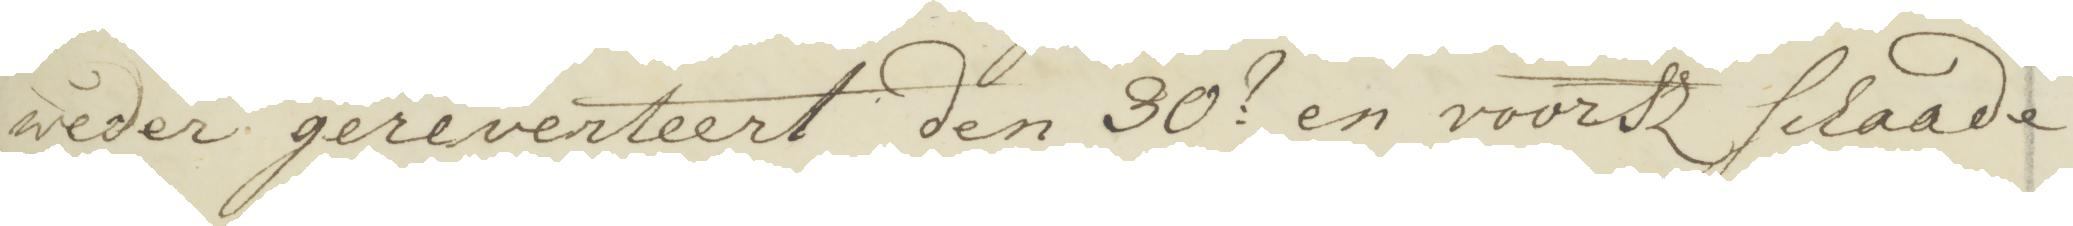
weder gereverteert den 30.' en voorsz schaade
